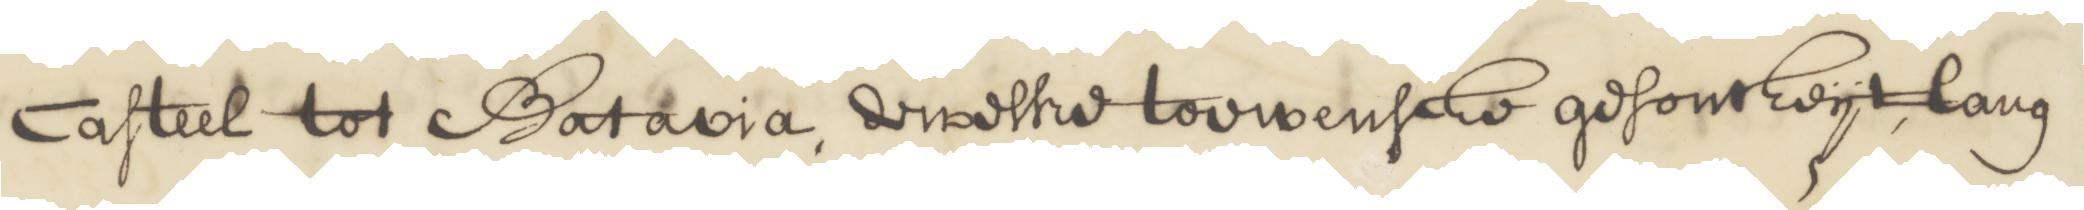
casteel tot Batavia, dewelke toewensche gesontheijt, lang
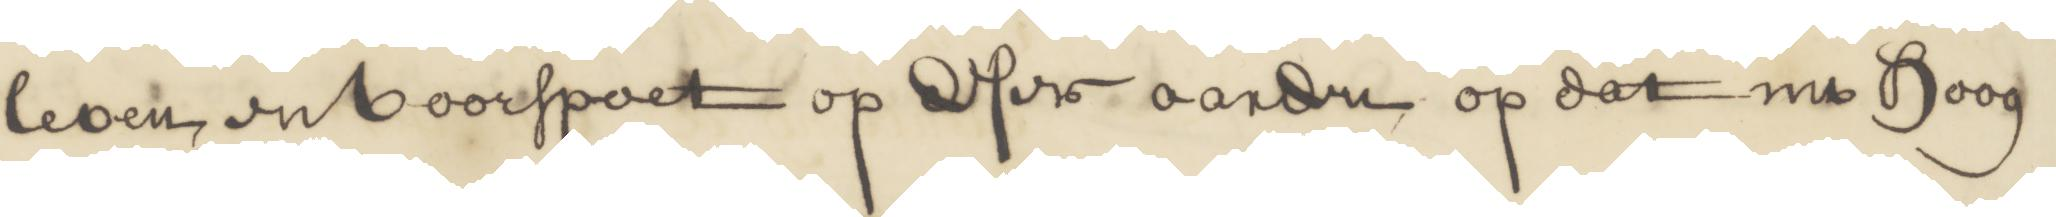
leven en voorspoet op deser aarden, op dat uw hoog
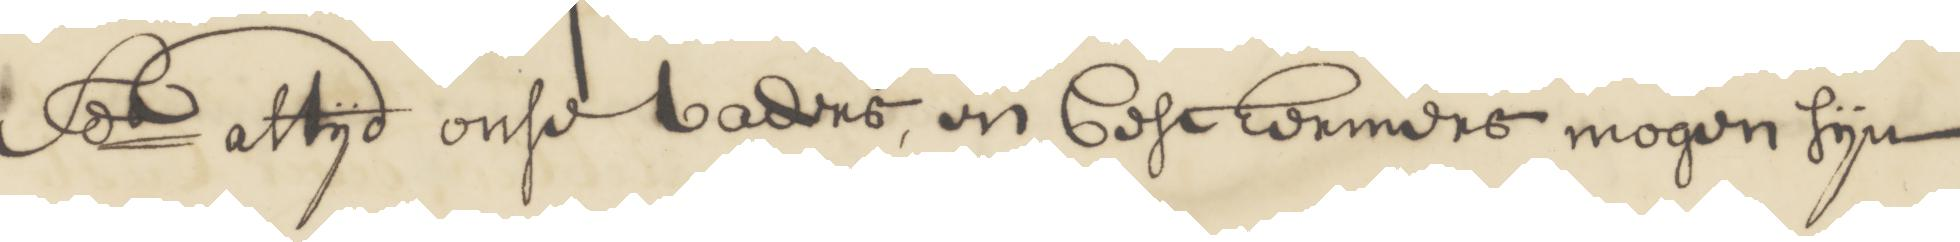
Ed=s altijd onse vaders, en beschermers mogen sijn,
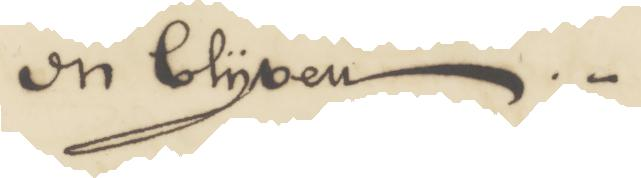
en blijven. —
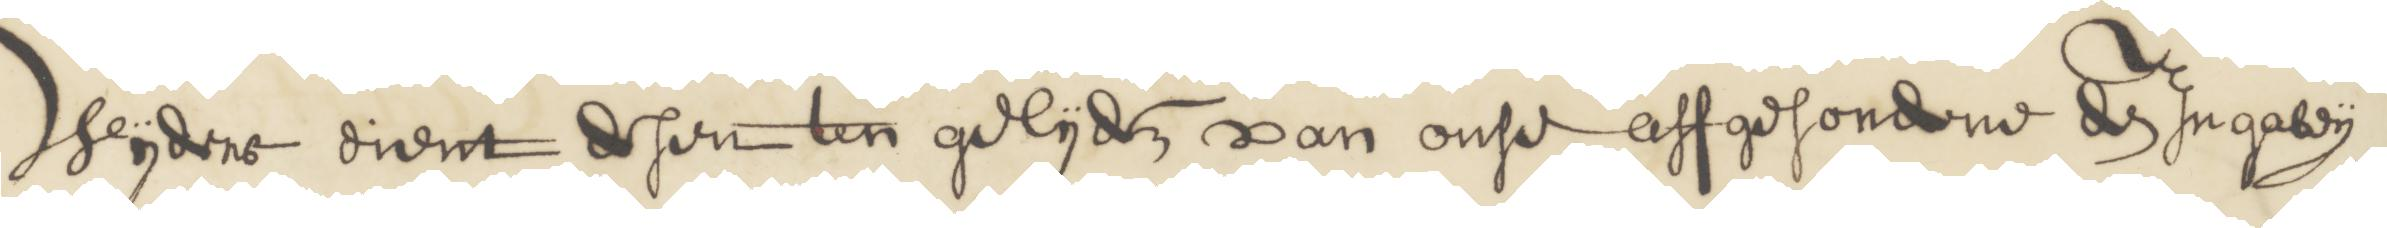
Wijders dient desen ten gelijden van onse affgesondene den Jngabeij
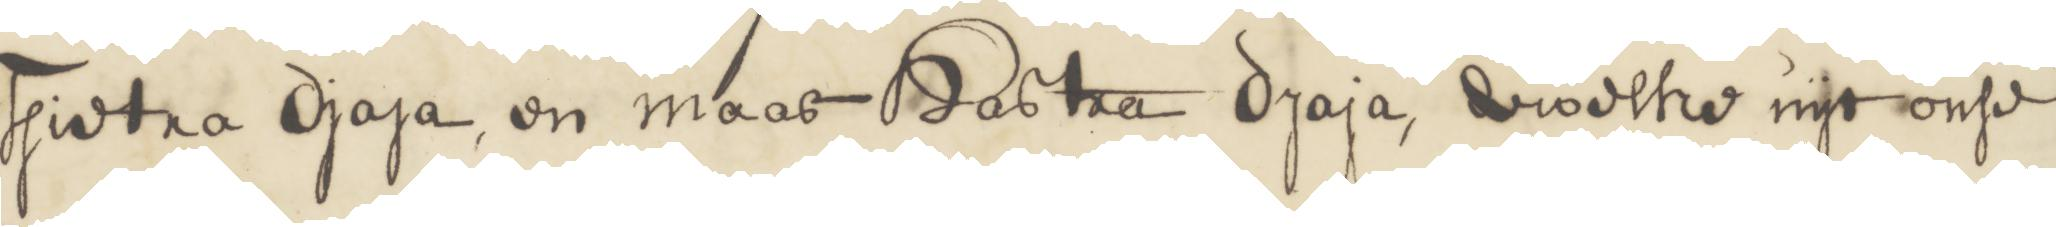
Tsietra djaja, en maas hastra djaja, dewelke uijt onse
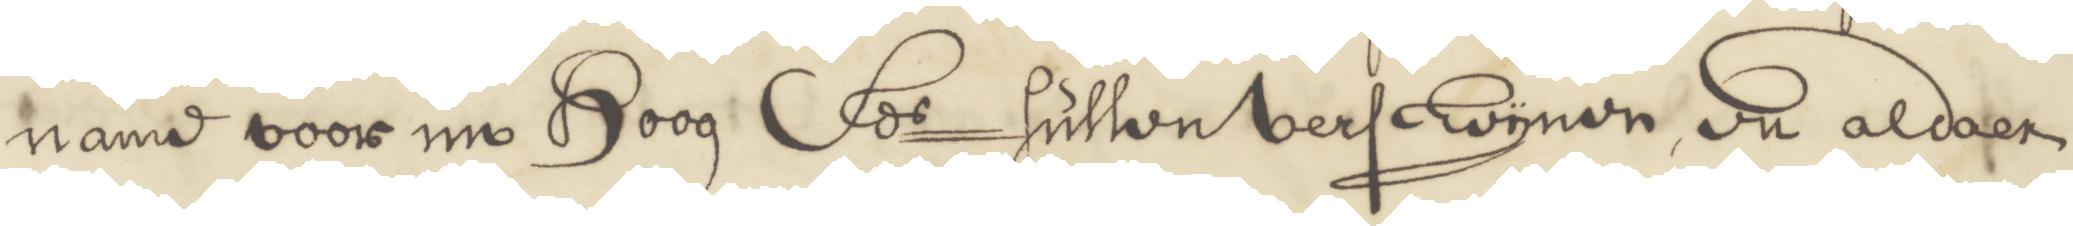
name voor uw hoog Ed=s sullen verscheijnen, en aldaer
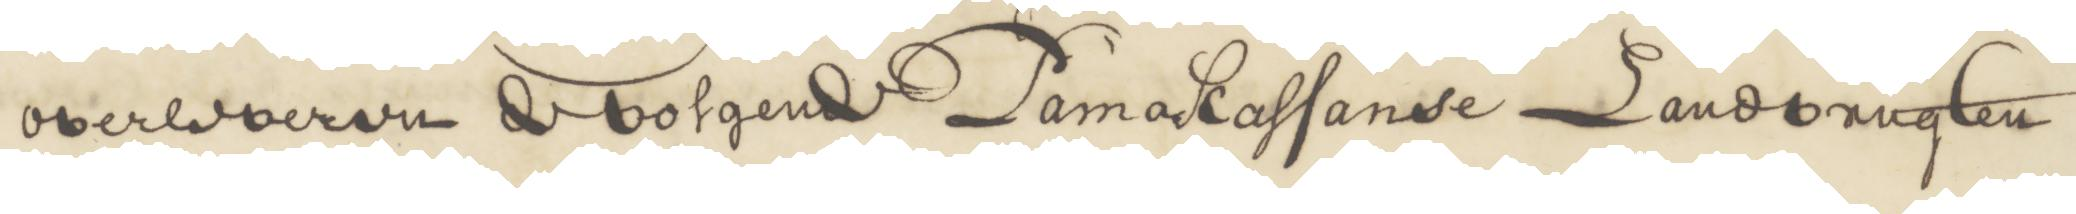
overleveren de volgende Pamakassanse Landvrugten
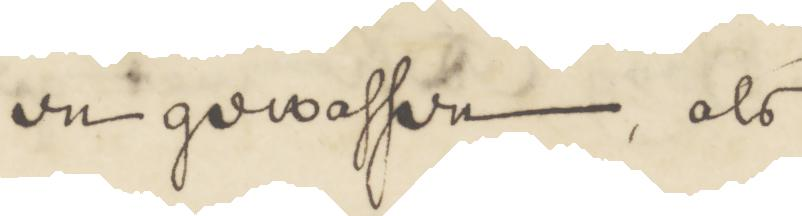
en gewassen, als
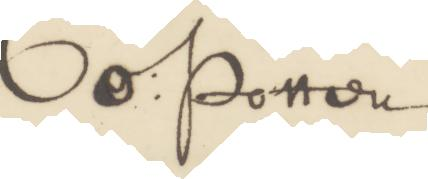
60: potten
